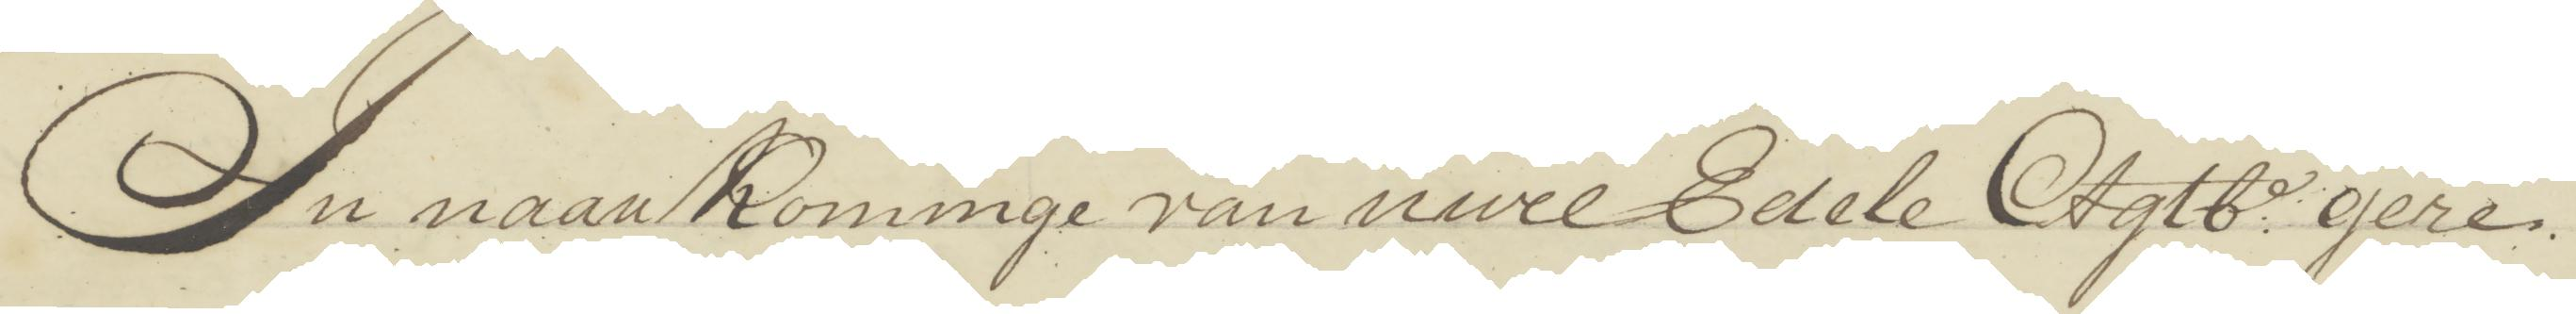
In naar Kominge van uwel Edele Agtb:e gere.
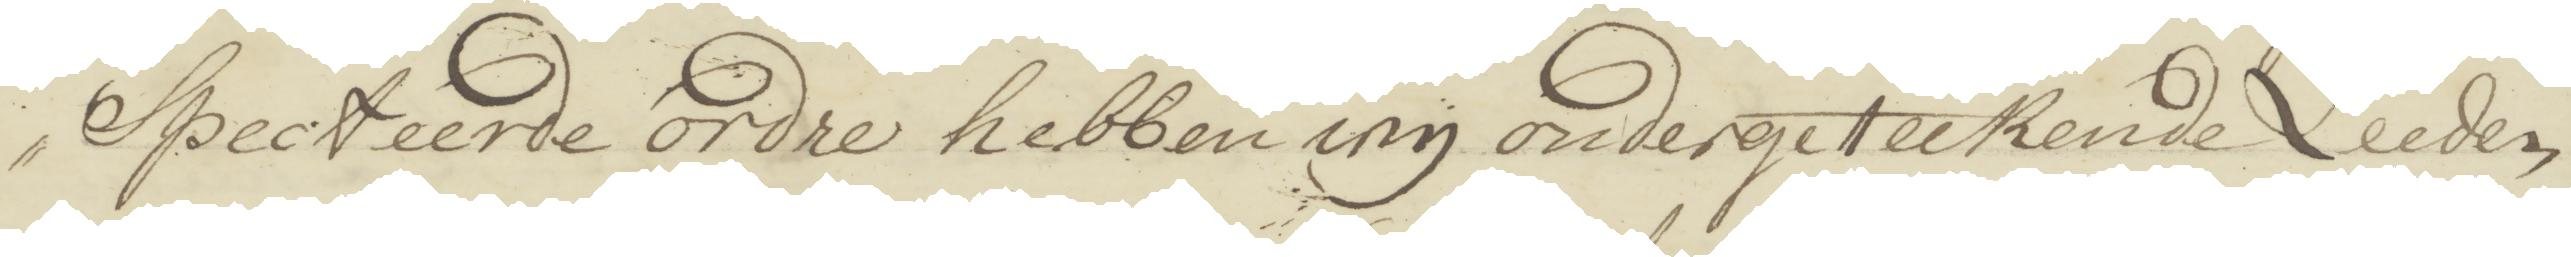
„specteerde ordre hebben wij ondergeteekende Leeden
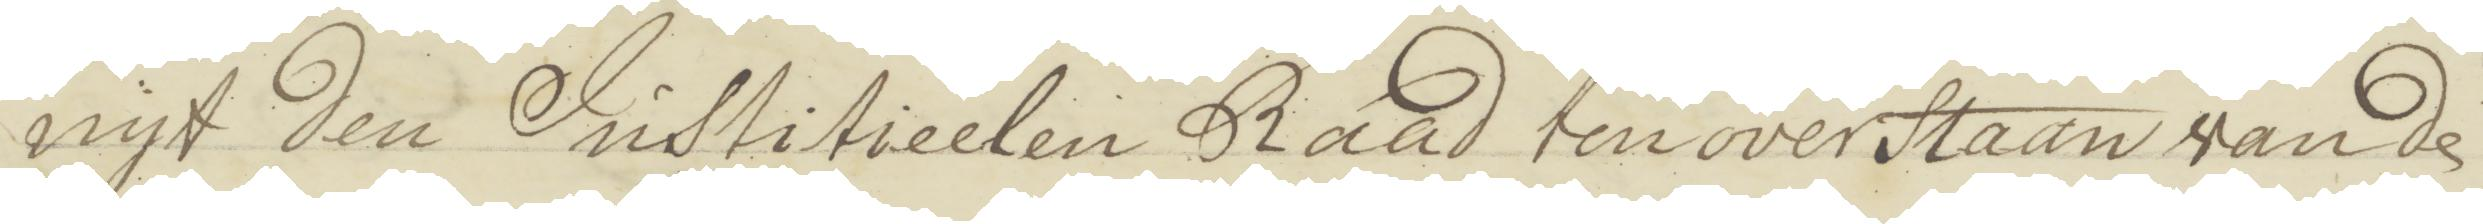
uijt den Iustitieelen Raad ten overstaan van den
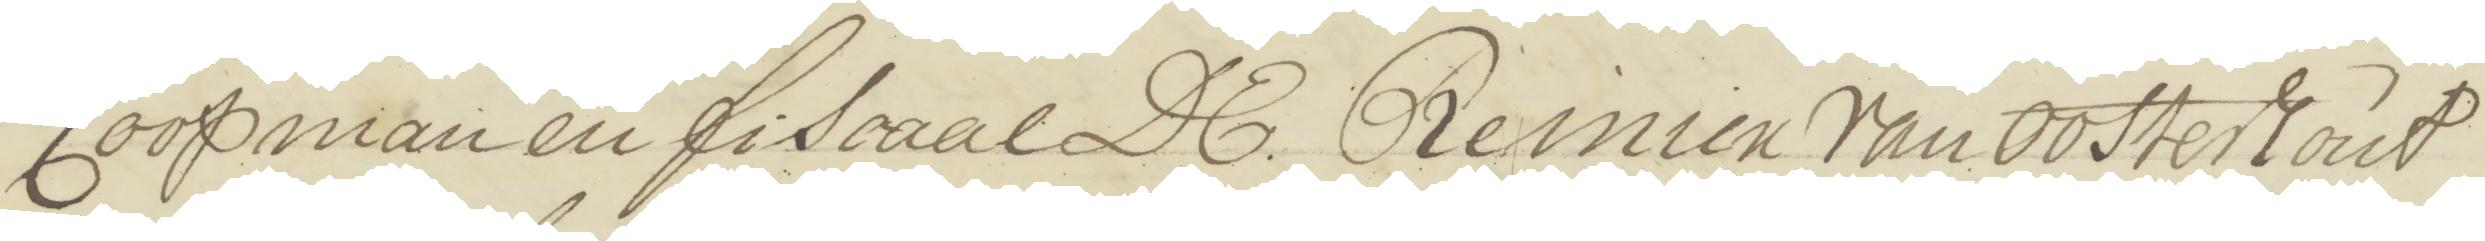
Coopman en fiscaal DE: Reinier van oosterhout
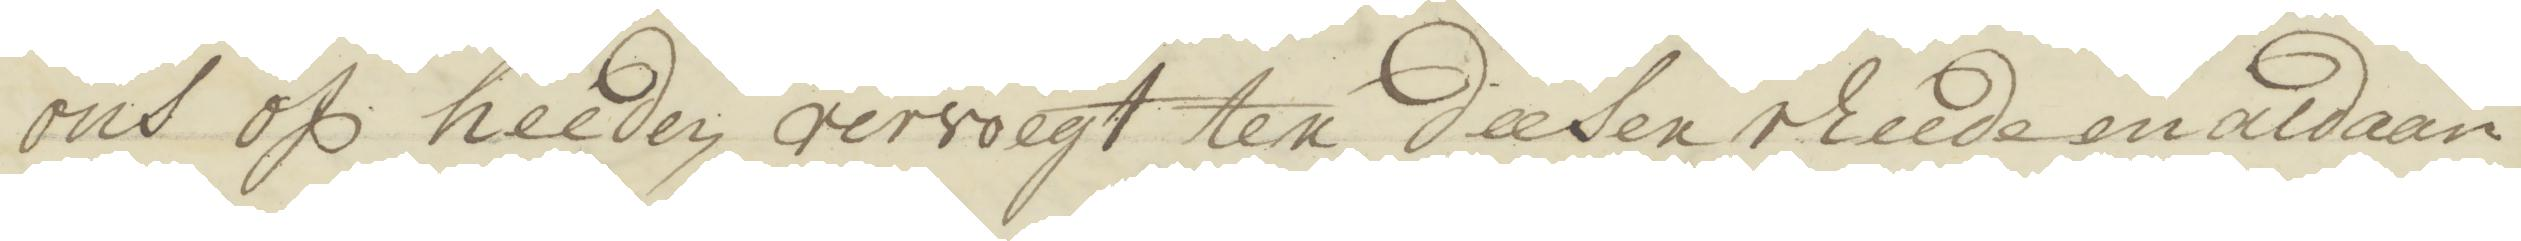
ons op heeden vervoegt ter deeser rheede en aldaar
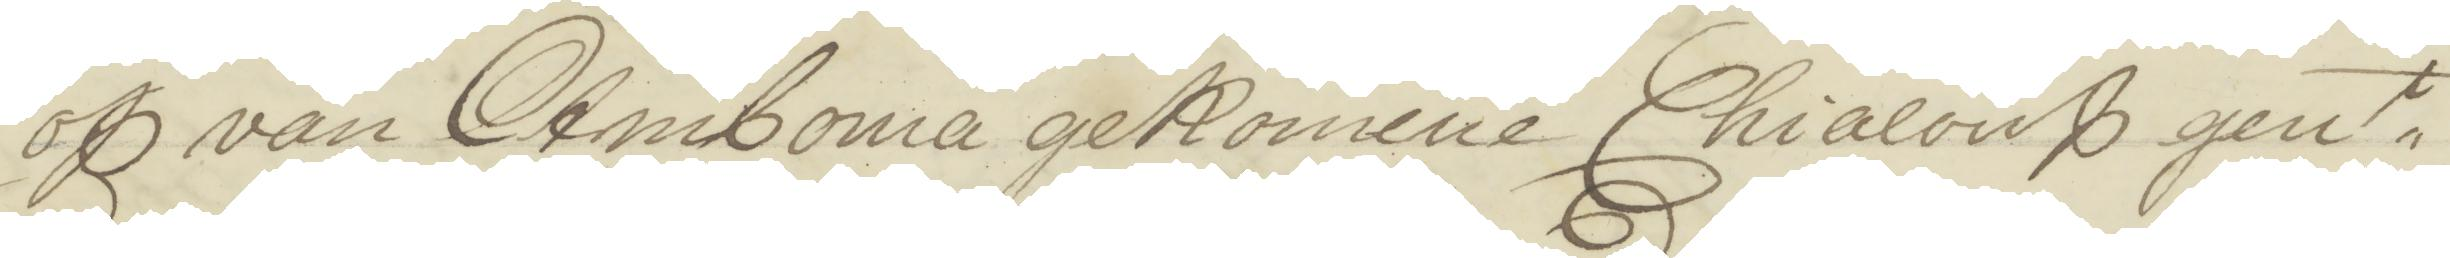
op van Amboina gekomene Chialoup gen„t
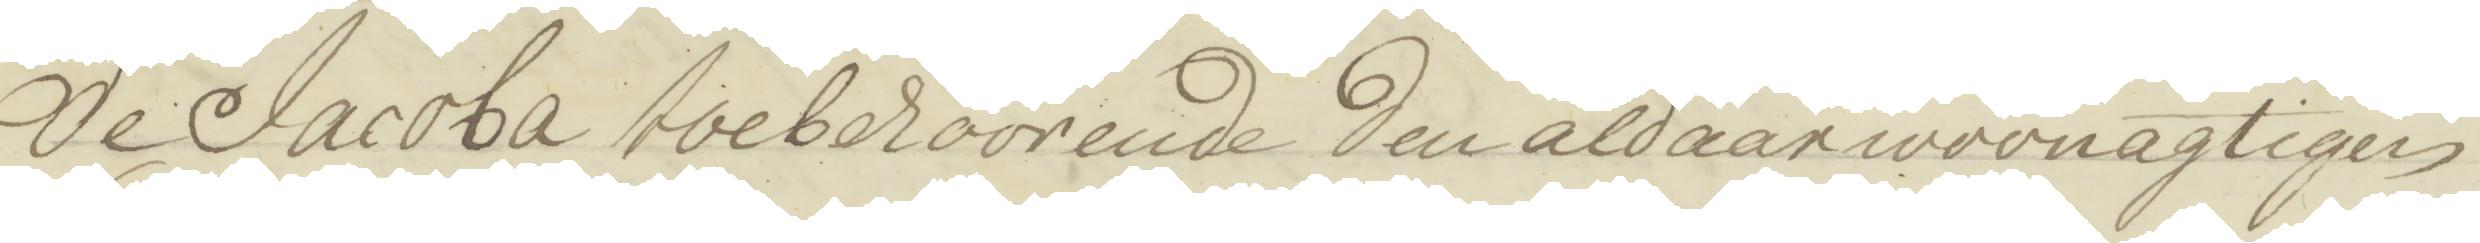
de Iacoba toebehoorende den aldaar woonagtigen
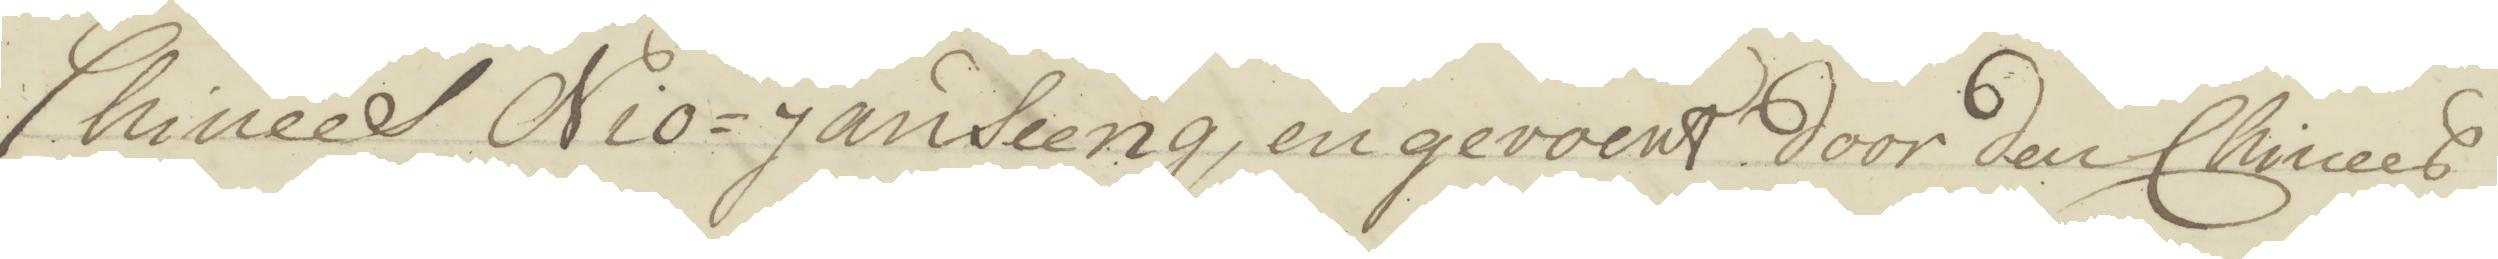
Chinees Nio=jauseeng, en gevoert door den Chinees
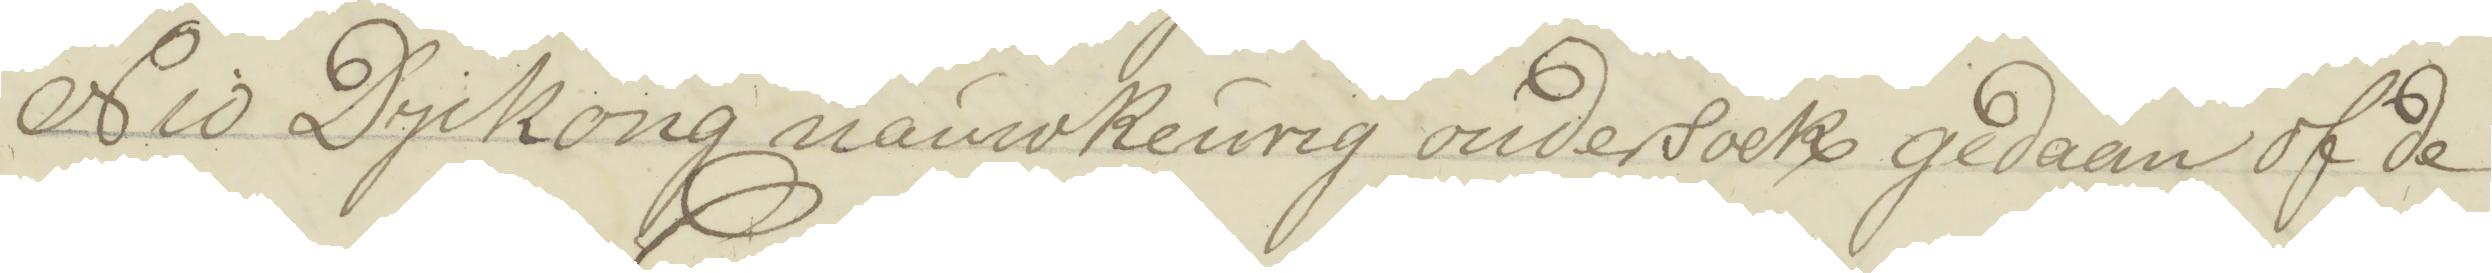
Nio Djikong nauwkeurig ondersoek gedaan of de
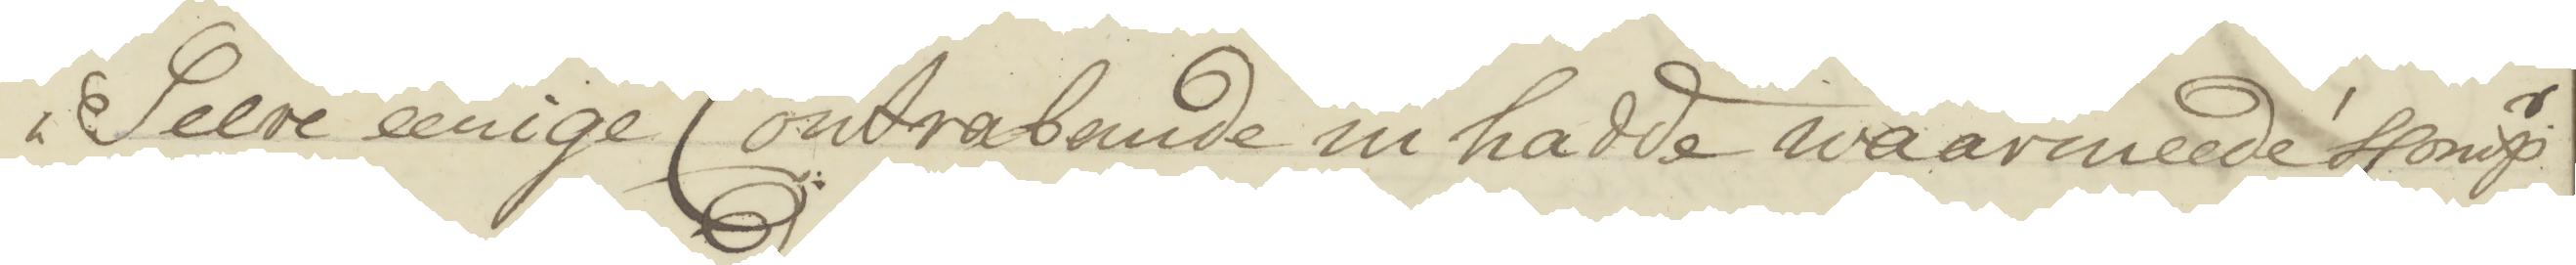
„selve eenige Contrabande in hadde waarmeede 'scomp:s
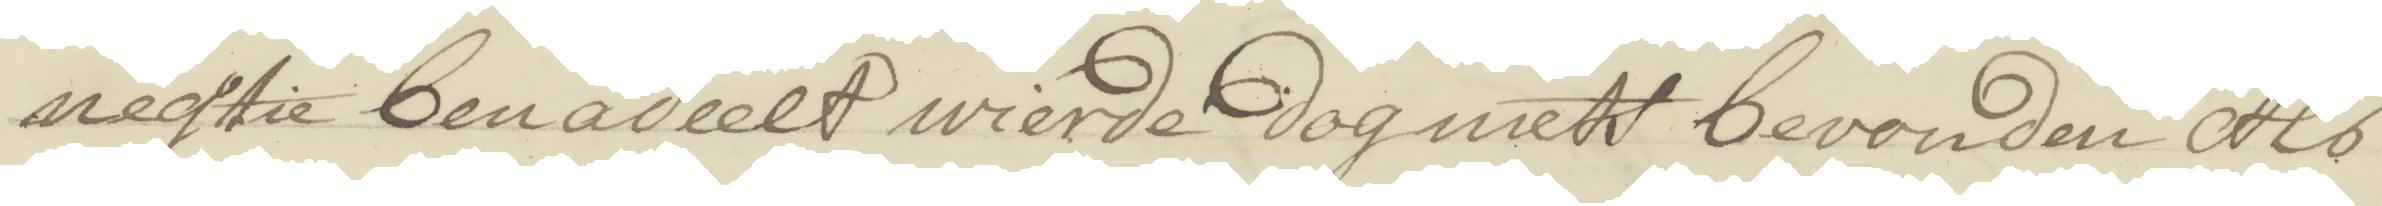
negotie benadeelt wierde dog niets bevonden Als
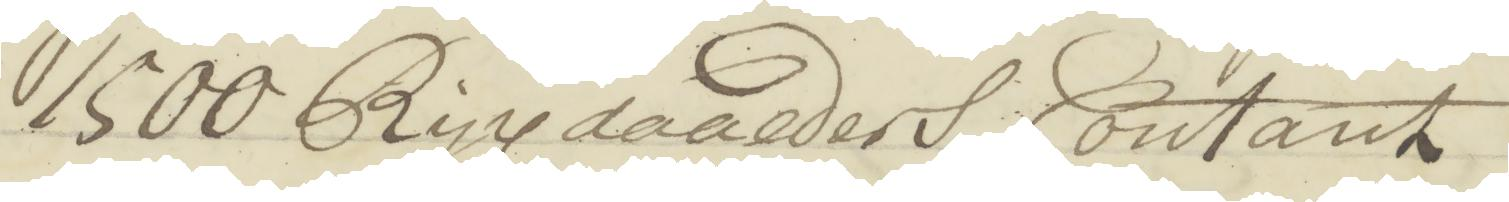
1500 Rijxdaalders Contant
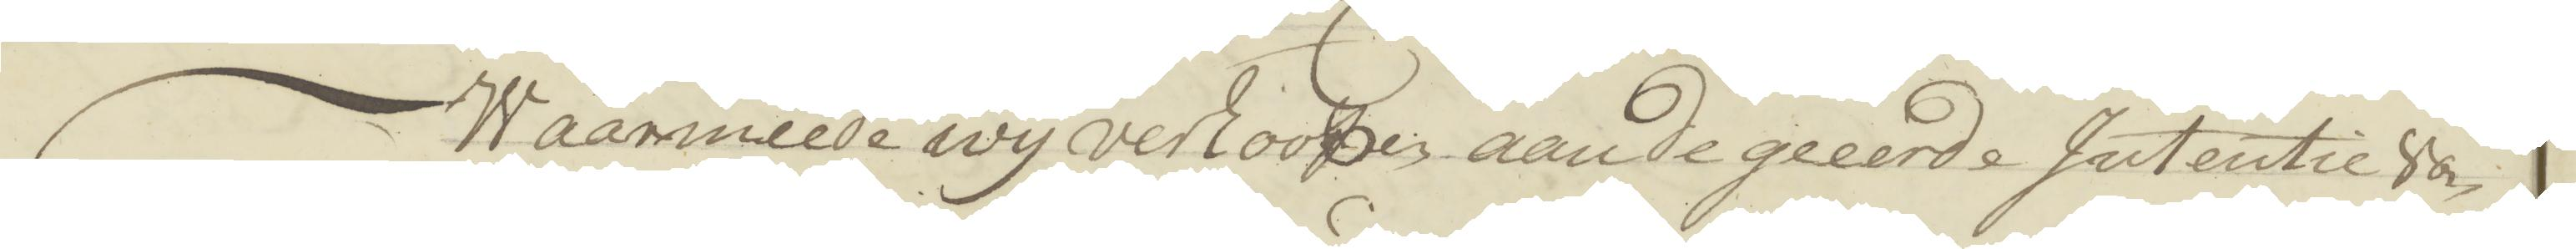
Waarmeede wij verhoopen aan de geeerde Jntentie van
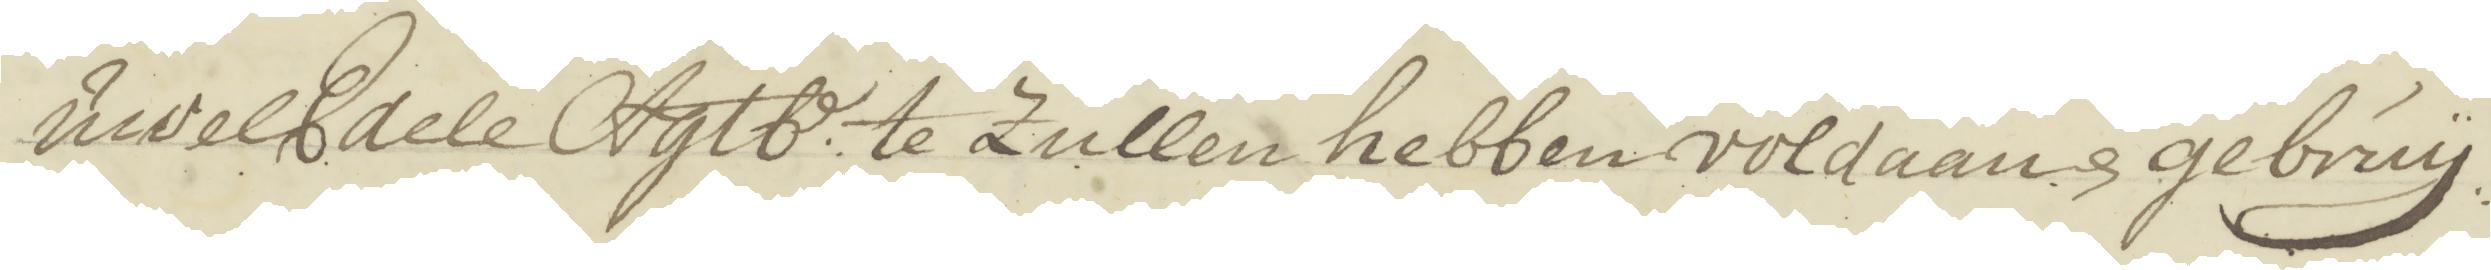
uwelEdele Agtb: te zullen hebben voldaan en gebruij:
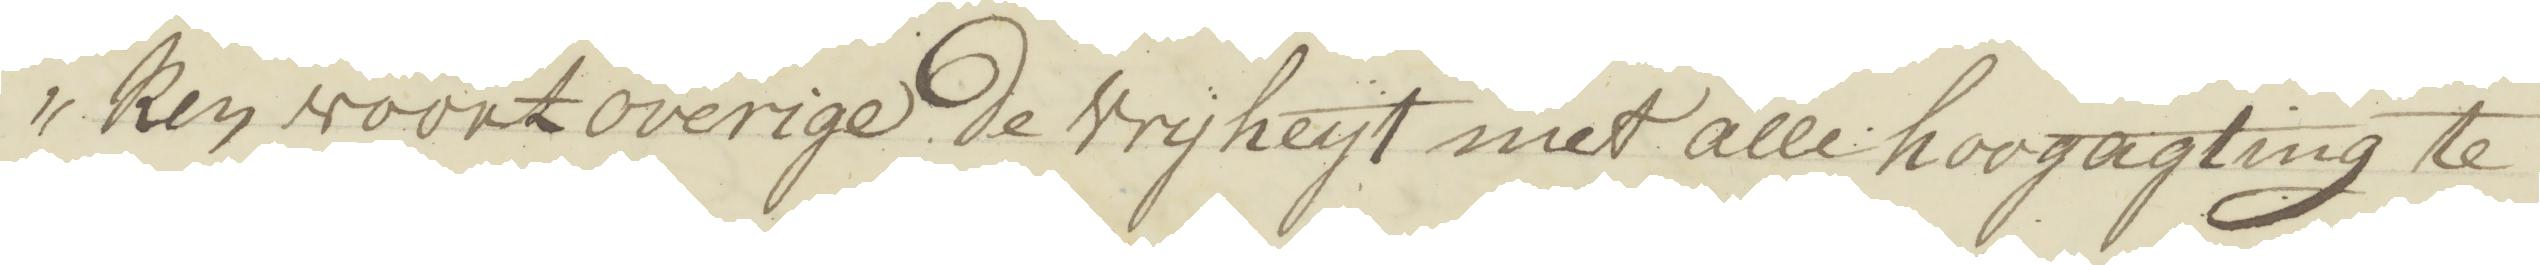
„ken voor 't overige de vrijheijt met alle hoogagting te
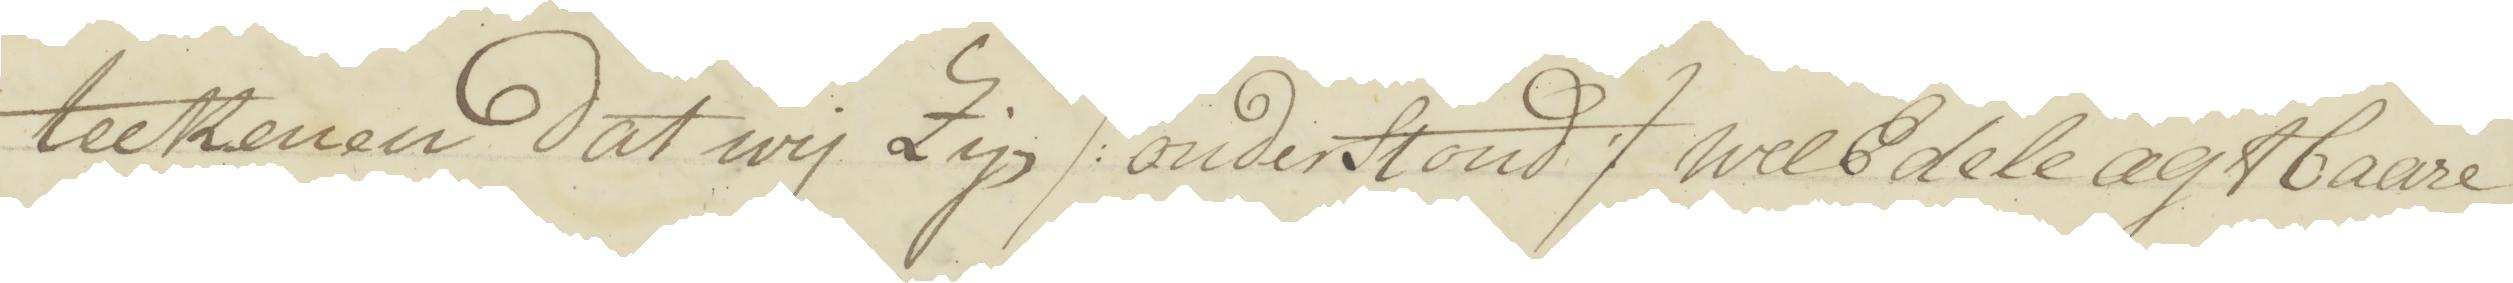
teekenen dat wij zijn /:onderstond:/ wel Edele agtbaare
